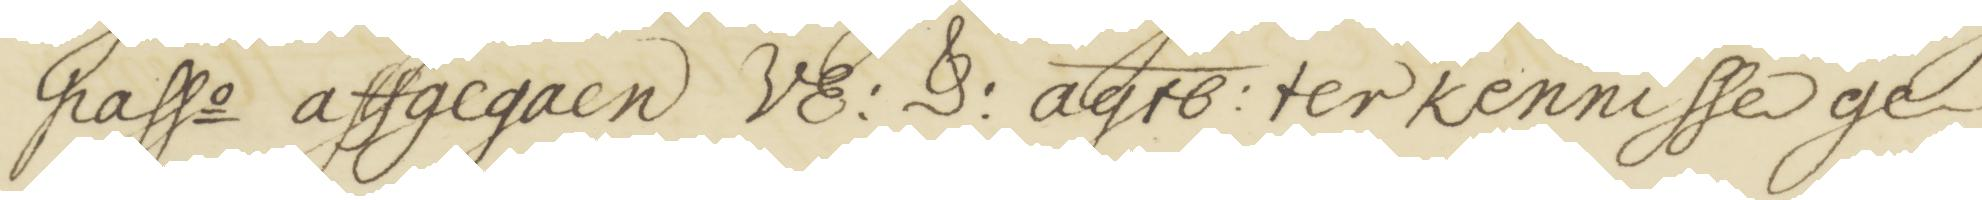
pass=o affgegaen VE:H: agtb: ter kennisse ge
